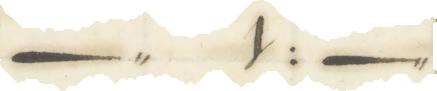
—„ 1: —„
